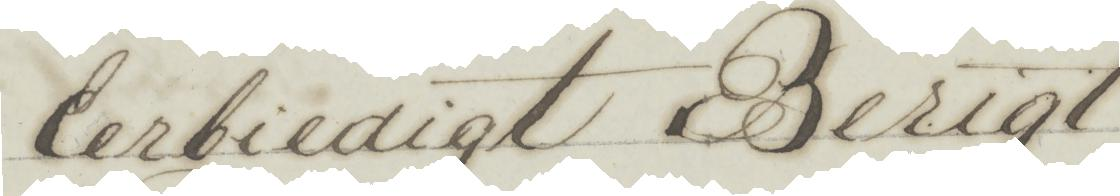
Eerbiedigt Berigt
